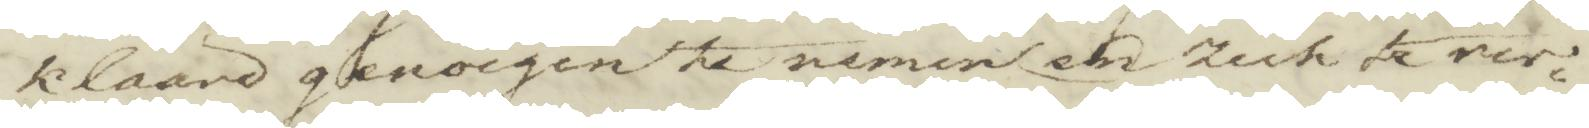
klaard genoegen te nemen en zich te ver„
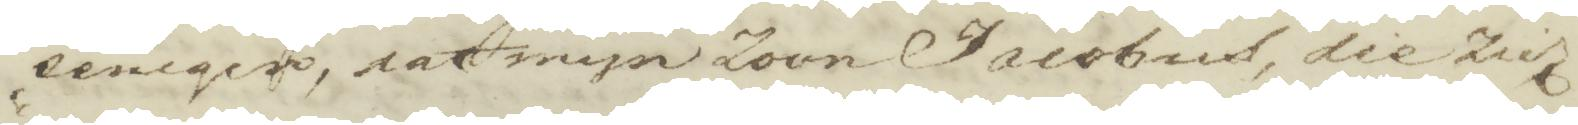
„eenigen, dat myn zoon Jacobus, die zich
